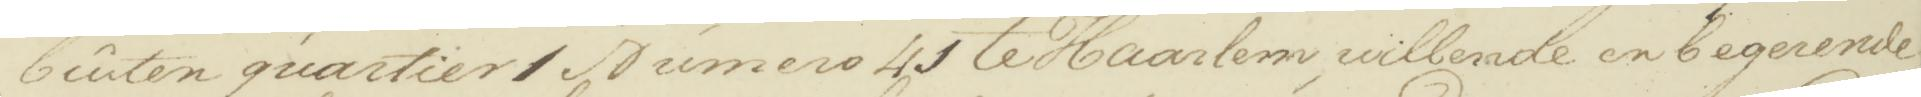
buiten quartier 1 Numero 41 te Haarlem, willende en begerende
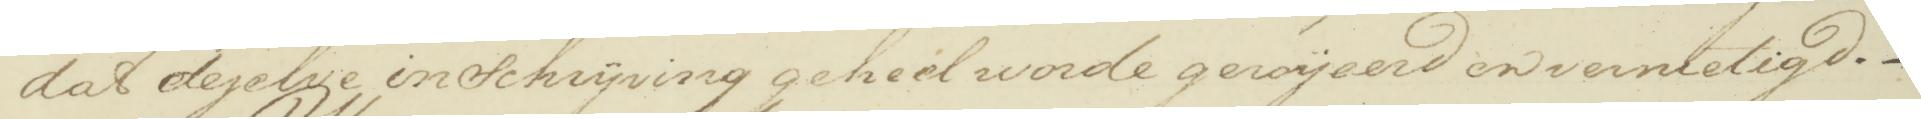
dat dezelve inschrijving geheel worde geroijeerd en vernietigd.-
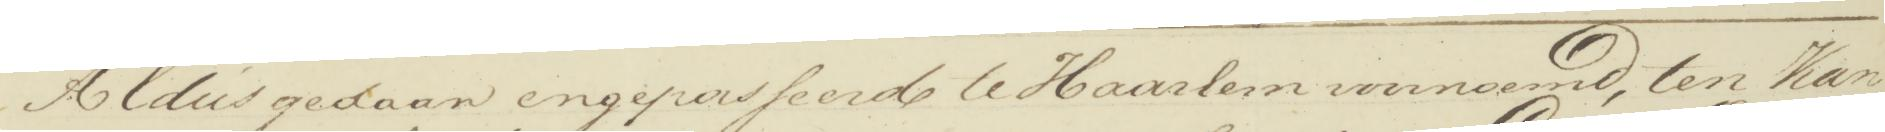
Aldus gedaan en gepasseerd te Haarlem voornoemd, ten kan,
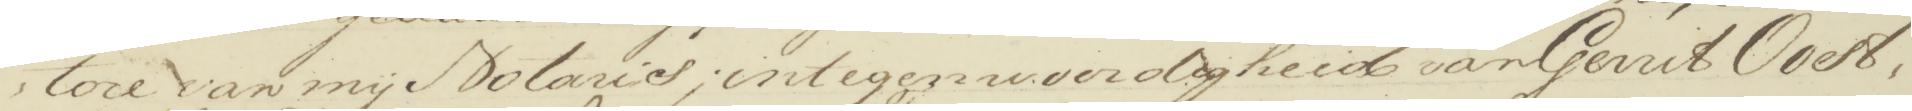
,tore van mij Notaris; in tegenwoordigheid van Gerrit Oost,
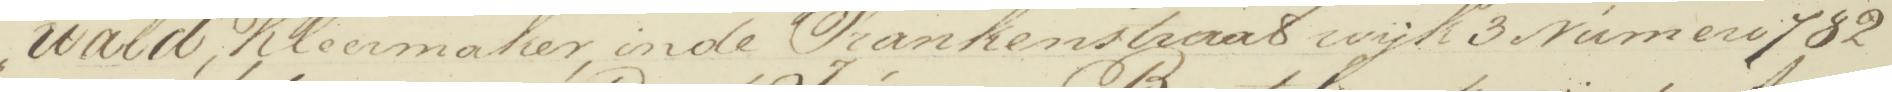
„wald, Kleermaker, in de Frankenstraat wijk 3 Numero 782
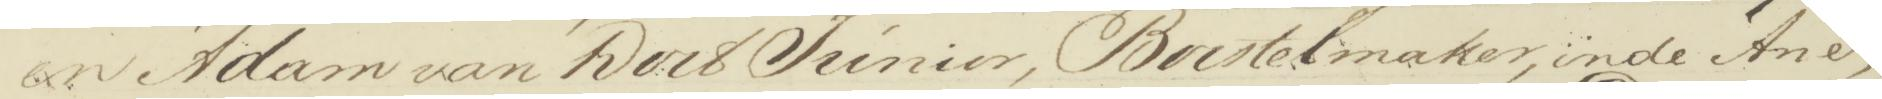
en Adam van Dort Juniur, Borstelmaker, in de Ane,
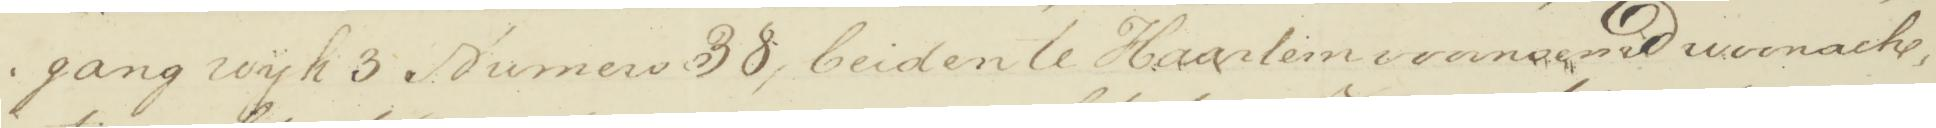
,gang wijk 3 Numero 38, beiden te Haarlem voornoemd woonach,
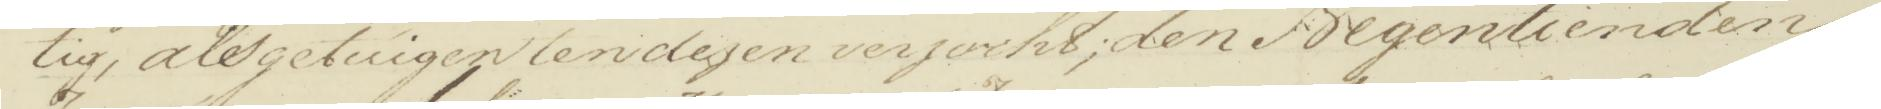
tig, als getuigen ten dezen verzocht; den Negentienden
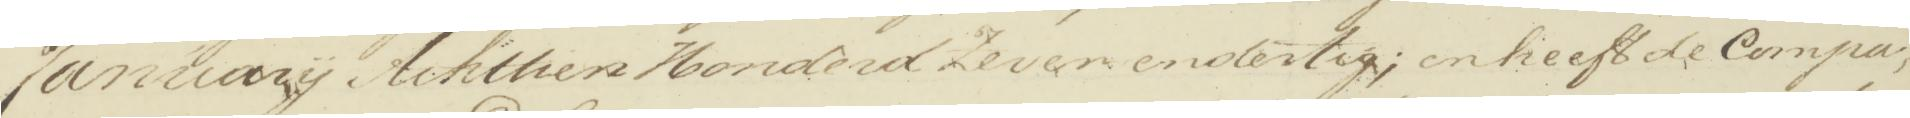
Januarij Achttien Honderd Zeven en dertig; en heeft de Compa„
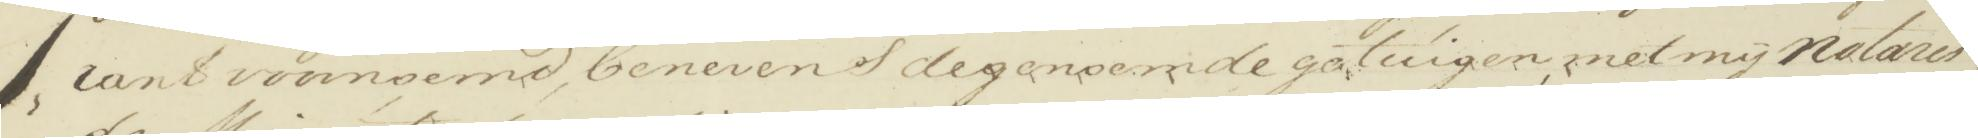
rant voornoemd, benevens de genoemde getuigen, met mij Notaris
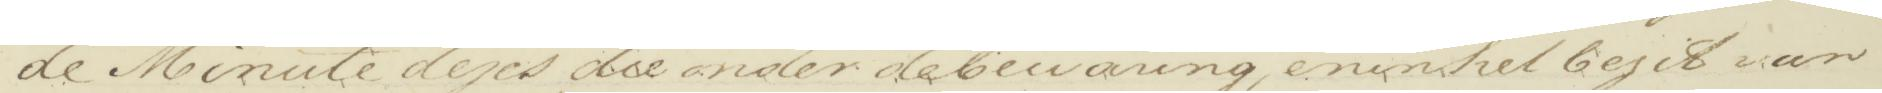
de Minute dezes, die onder de bewaring, en in het bezit van
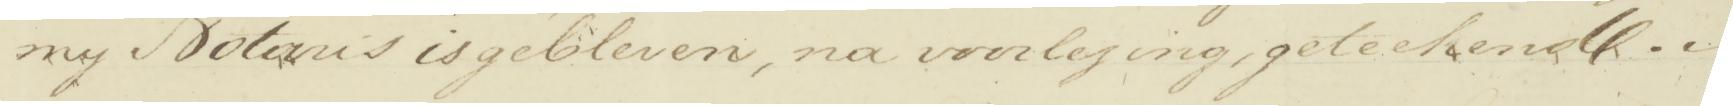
my Notaris is gebleven, na voorlezing, geteekend. .
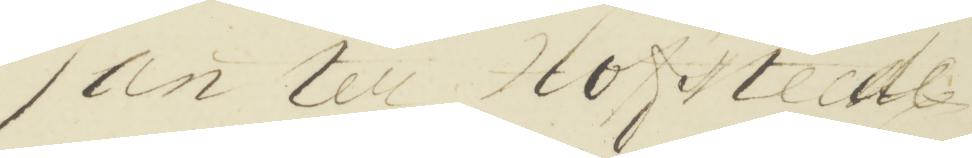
jan ter Hofsteede
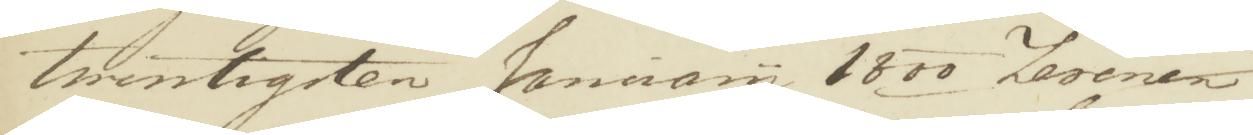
twintigsten Januarij 1800 Zevenen
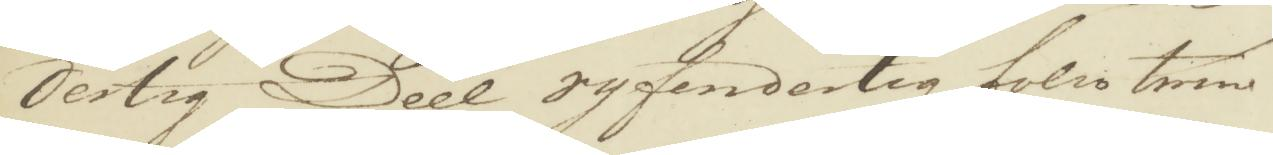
dertig Deel vyfendertig folio twin
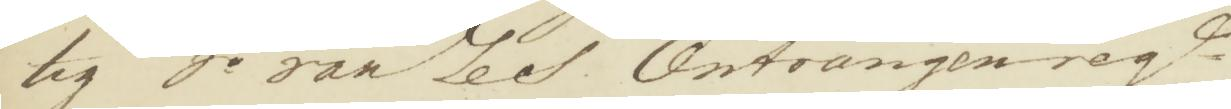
tig v,o van Zes. Ontvangen reg
